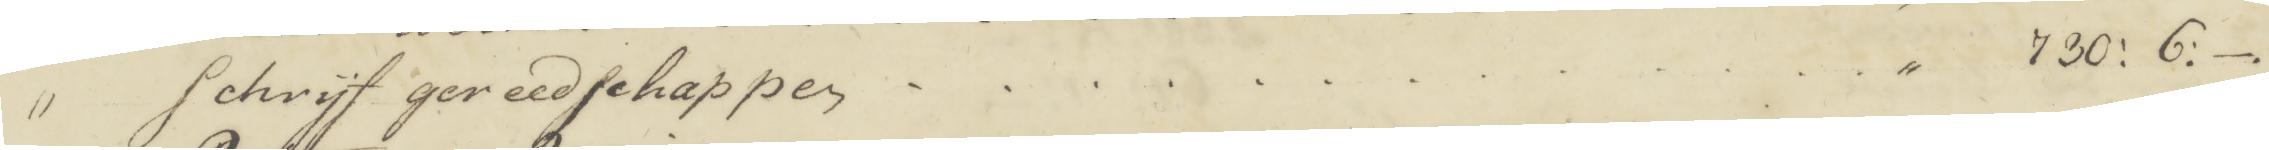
„ schrijf gereedschappen - - - - - - - - - - - - - „ 730:6:—.
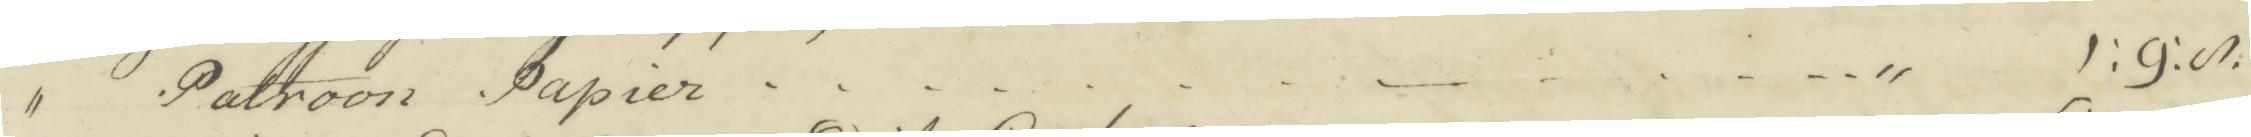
„ Patroon Papier - - - - - - - - - - - - „ 1:9:8.
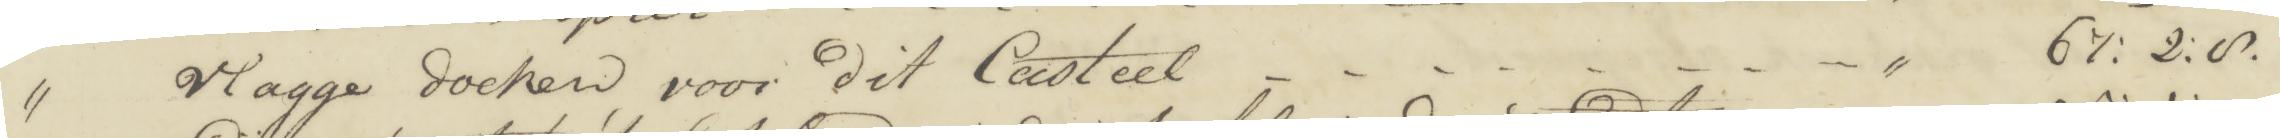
„ vlagge doeken voor dit Casteel - - - - - - - - „ 67: 2:8.
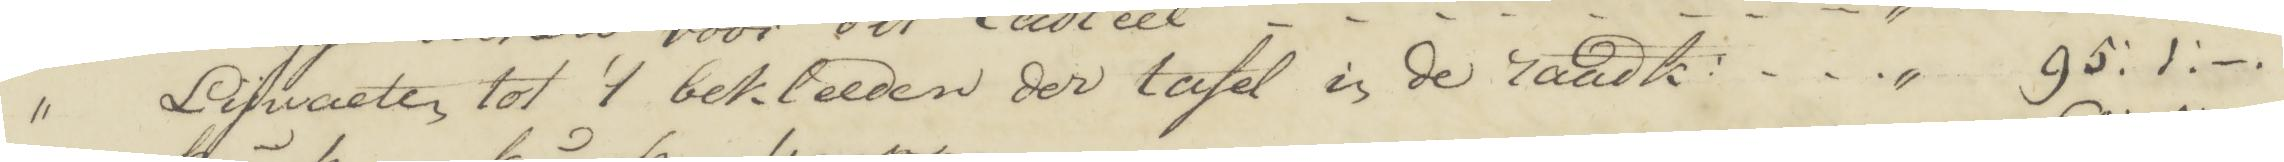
„ Lijwaeten tot ’t bekleeden der tafel in de raadk: - - - „ 95: 1:—.
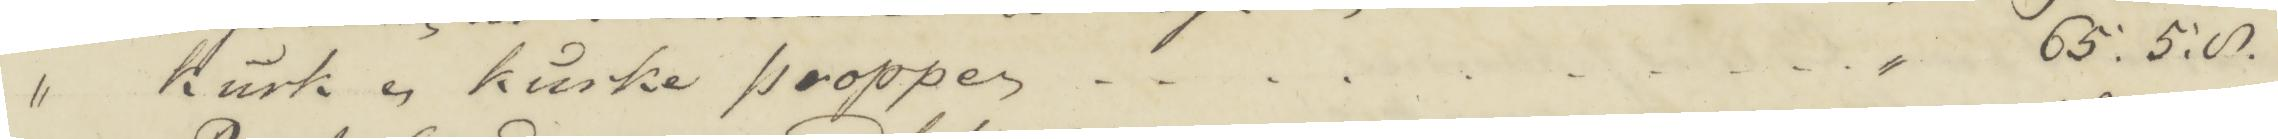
„ Kurk en kurke proppen - - - - - - - - - - „ 65: 5:8.
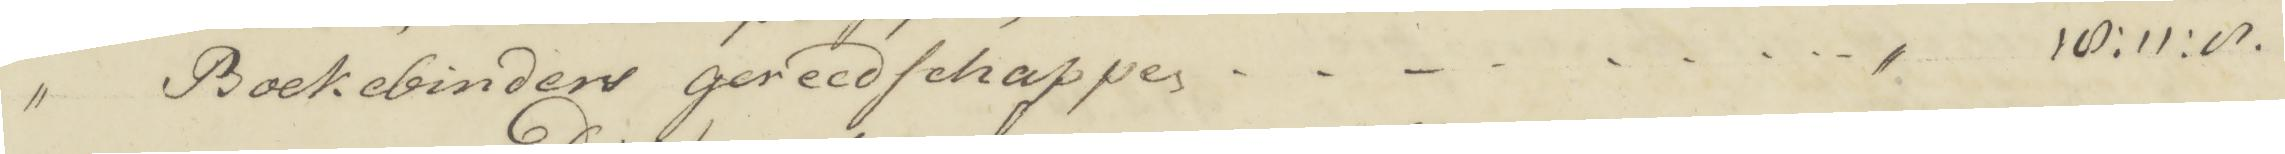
„ Boekebinders gereedschappen - - - - - - - - - „ 18:11:8.
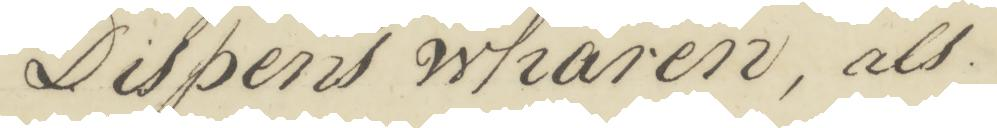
Dispens wharen, als
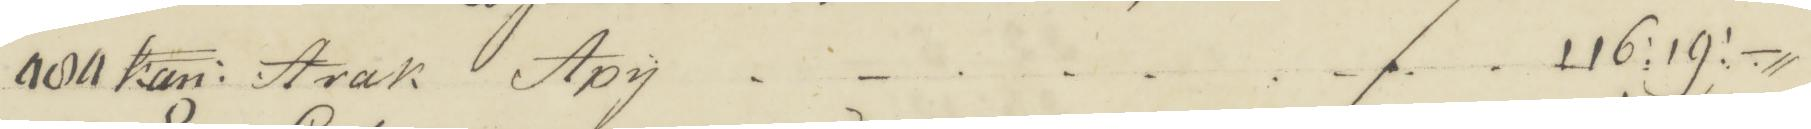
484 kan: Arak Apij - - - - - - - ƒ 116:19:—„
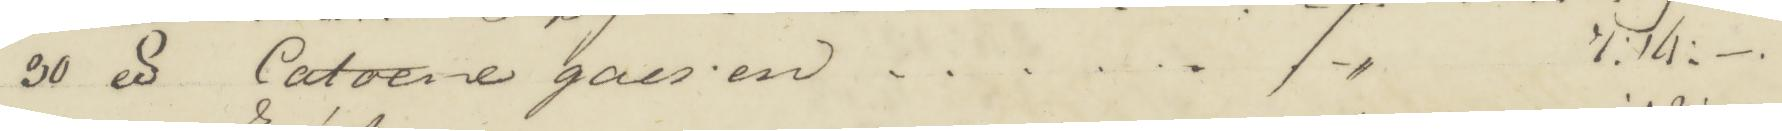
30 lb Catoene gaes en - - - - - - „ 7:14:—.
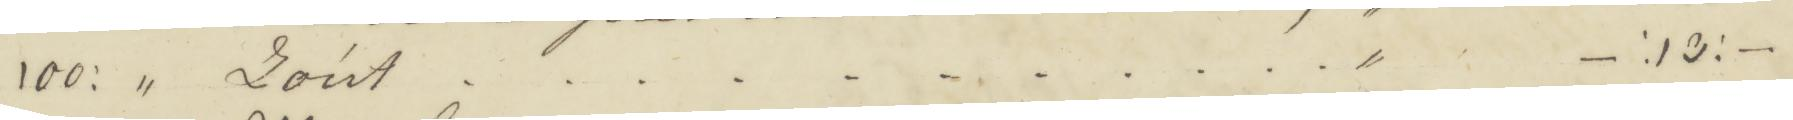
100: „ Zout - - - - - - - - - - - „ —:13:—
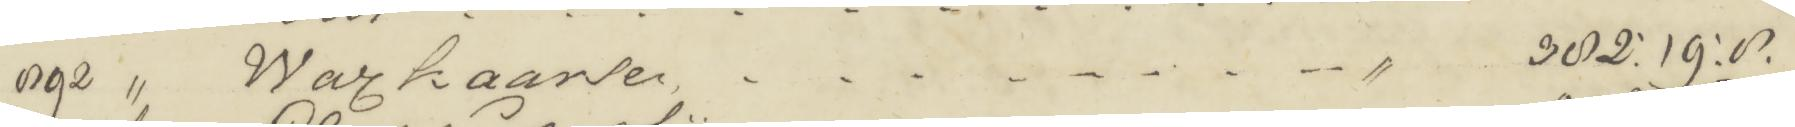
892 „ Waxkaarsen - - - - - - - - - „ 382: 19:8.
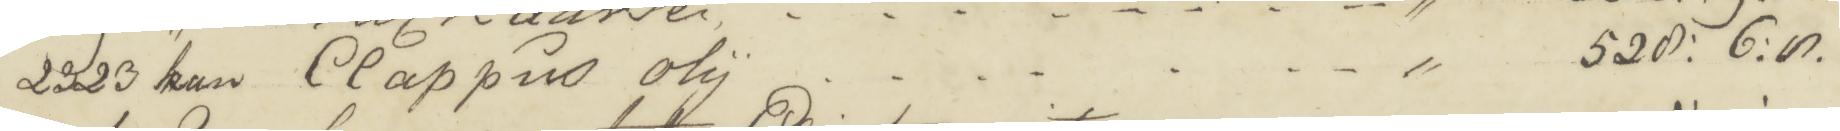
2323 kan Clappus olij - - - - - - - „ 528: 6:8.
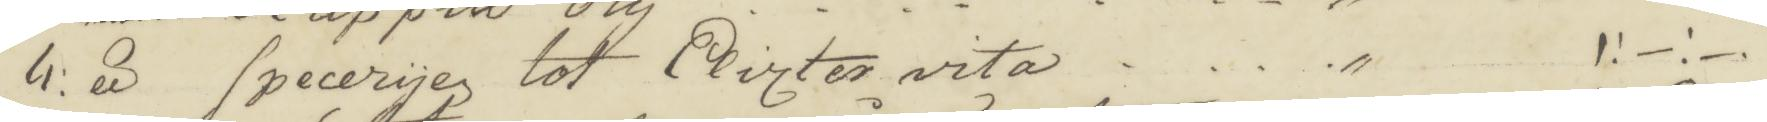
4: lb specerijen tot Elixter vita - - - „ 1:—:—.
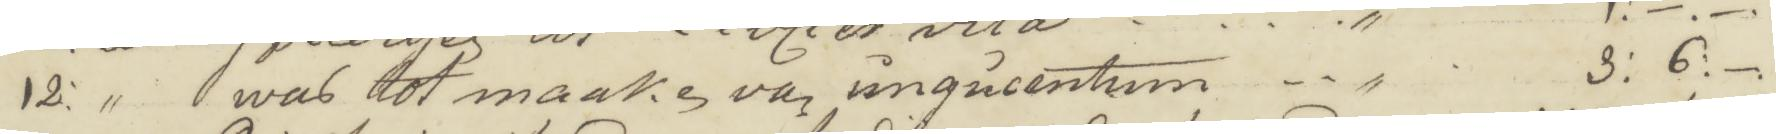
12: „ was tot maaken van ungucentum - - „ 3: 6:
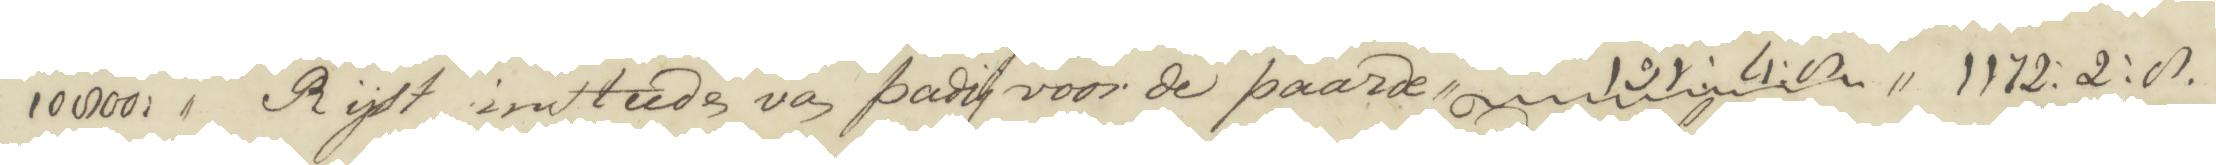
10800: „ Rijst insteede van padij voor de paarde „ 131: 4:8 „ 1172: 2:8.
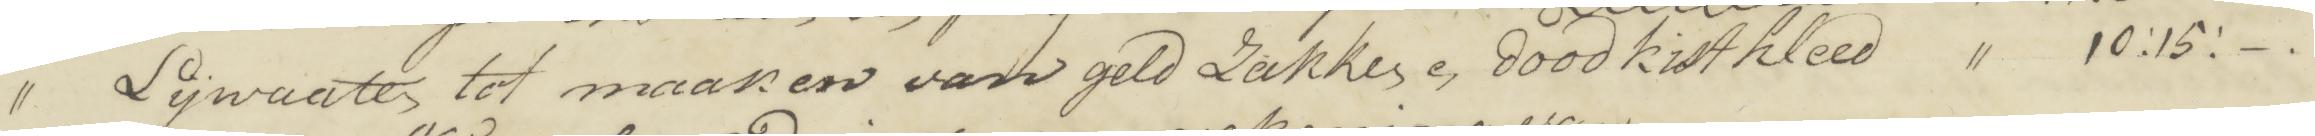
„ Lijwaaten tot maaken van geld zakken en dood kist kleed „ 10:15:—.
